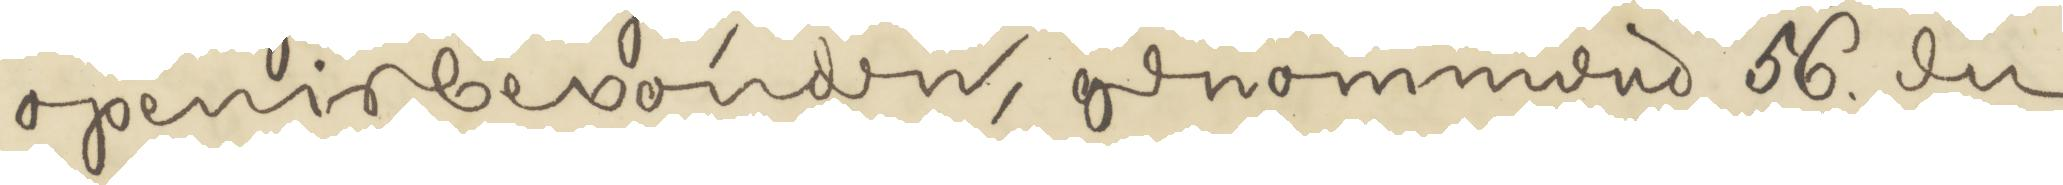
open is bevonden, genommerd 56. en
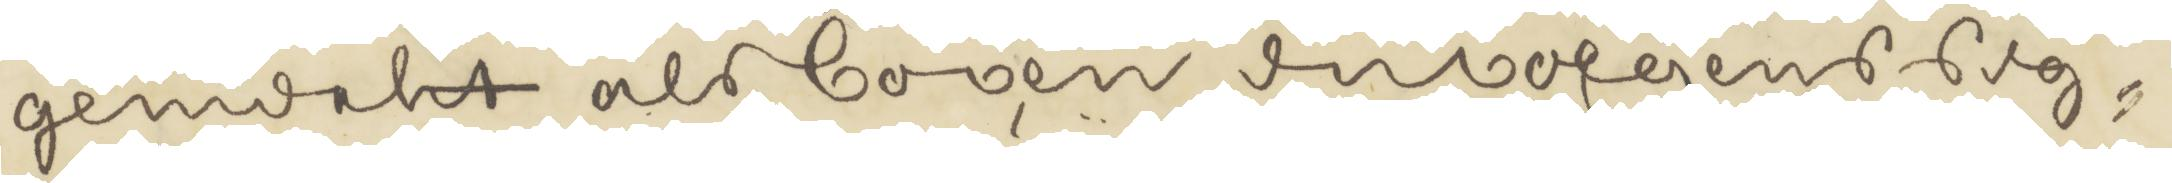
gemerkt als boven en volgens seg„
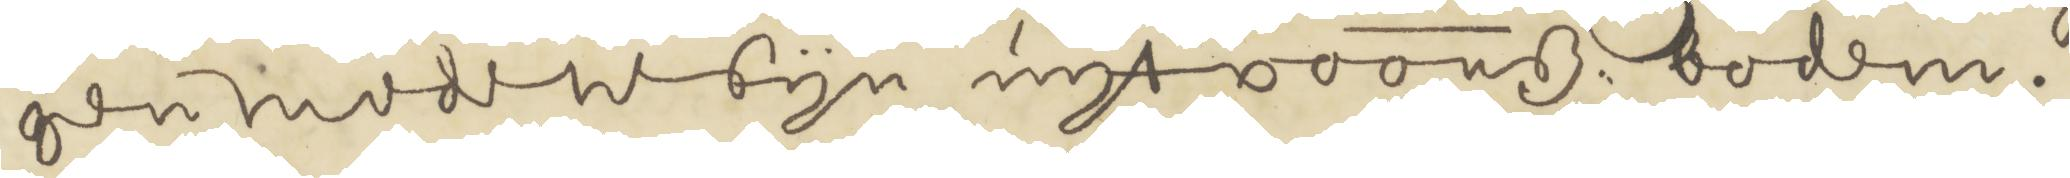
gen mede te sijn uijt voorsz: bodem.
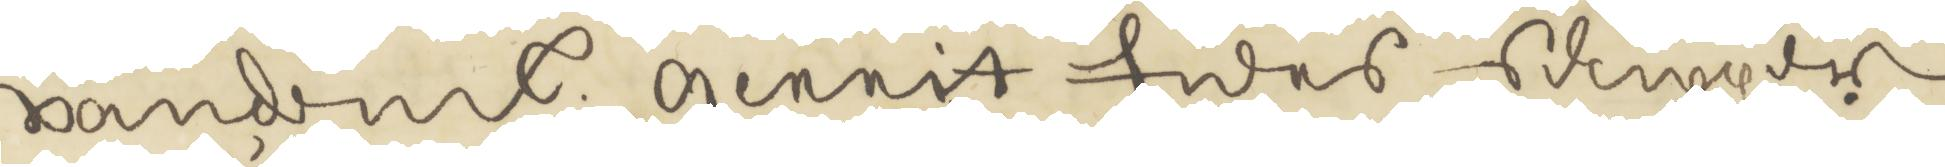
van den E: gerrit fiers schipper
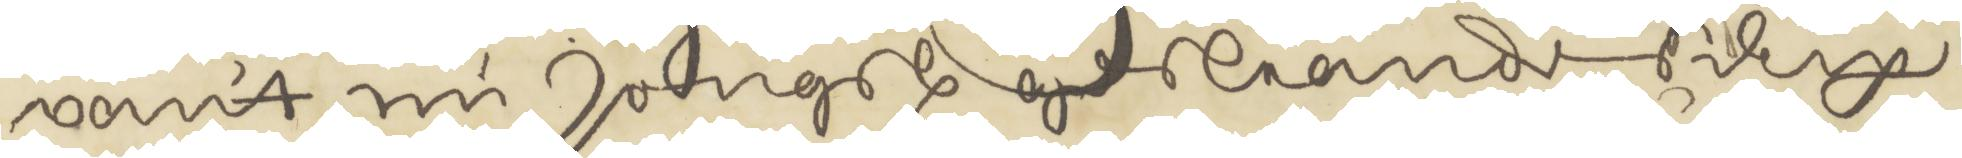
van’t nu Jongst gestrande schip
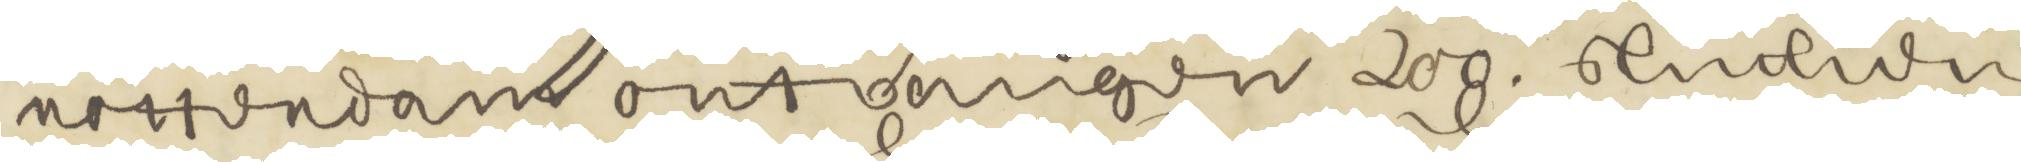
rotterdam ontvangen 209. stucken
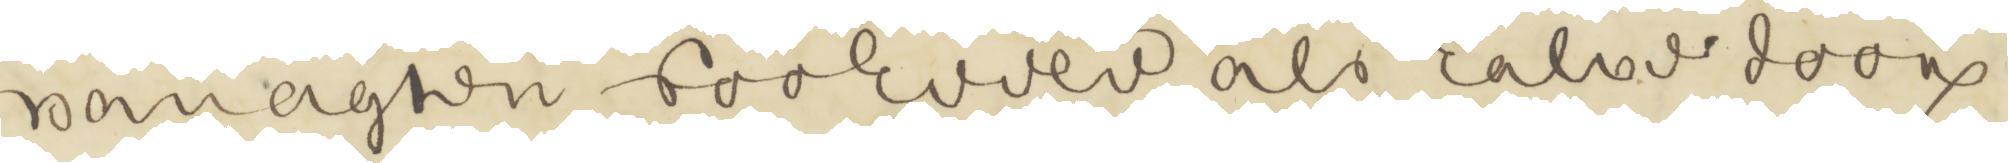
van agten soo heele als halve door
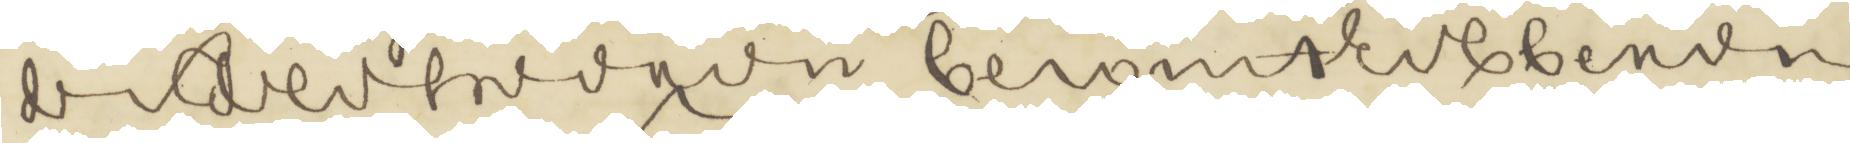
de Edele heeren bewinthebberen
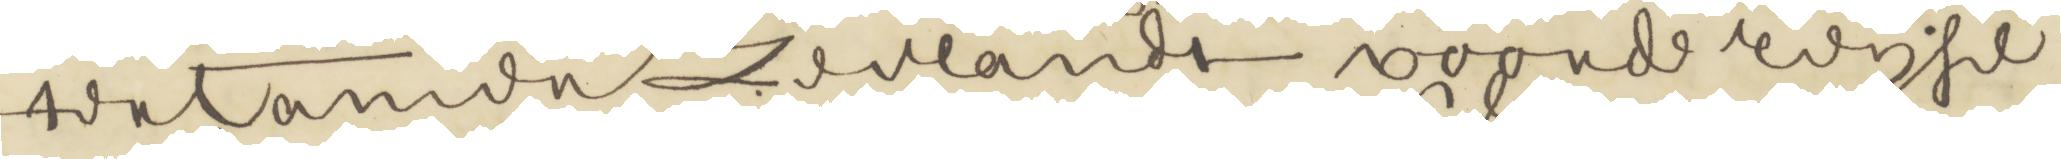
ter Camer zeelandt voorde reijse
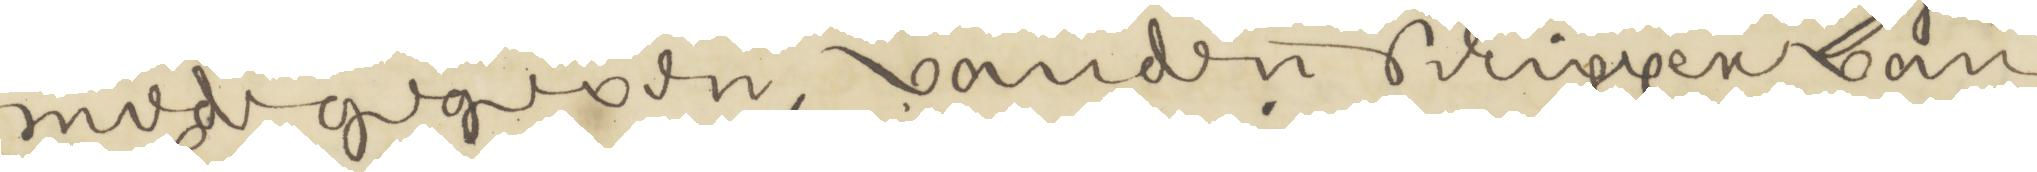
mede gegeven, van den schipper van
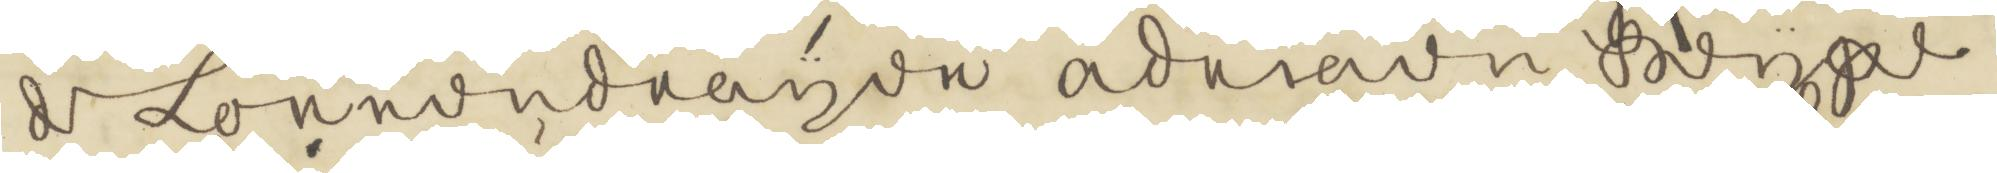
de Lorrendraijer adriaen heijpe
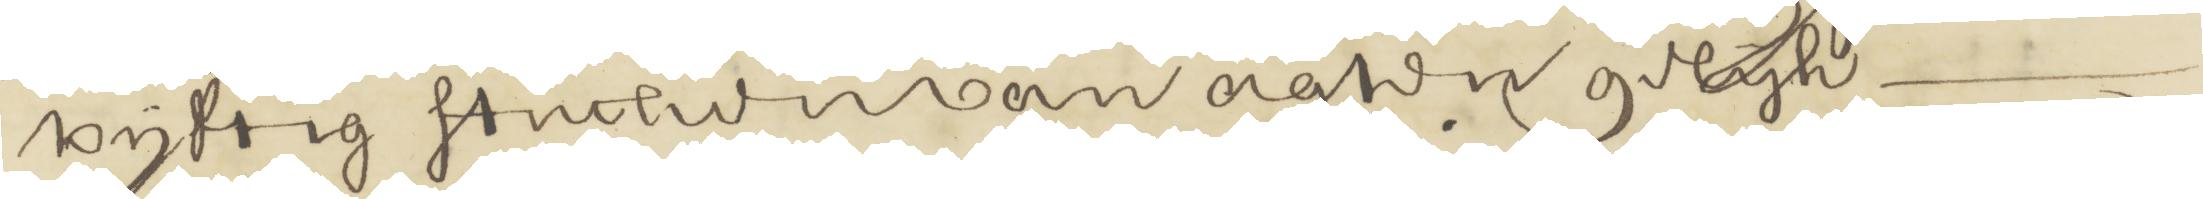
vijftig stucken van agten gelijk —
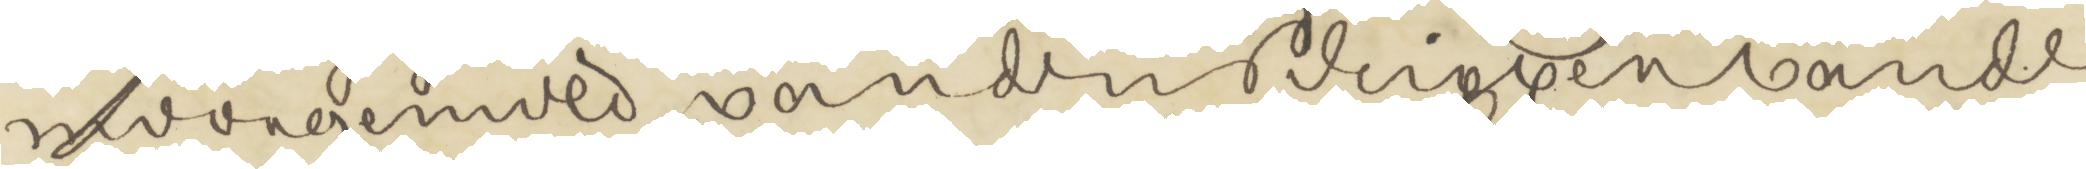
meergemeld van den schipper vande
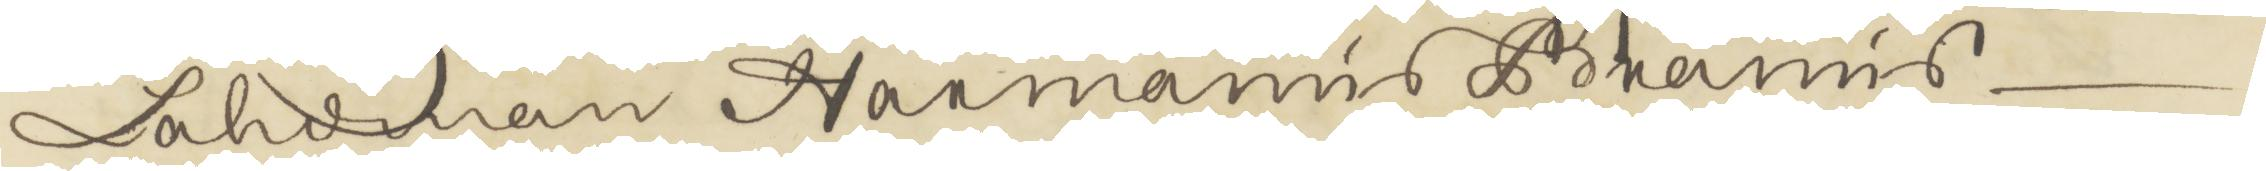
Lakeman Harmanus Branus —
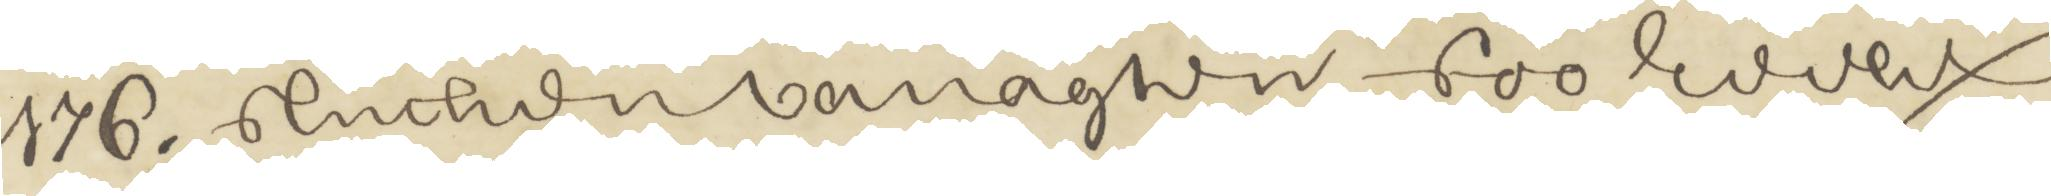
176. stucken van agten soo heele
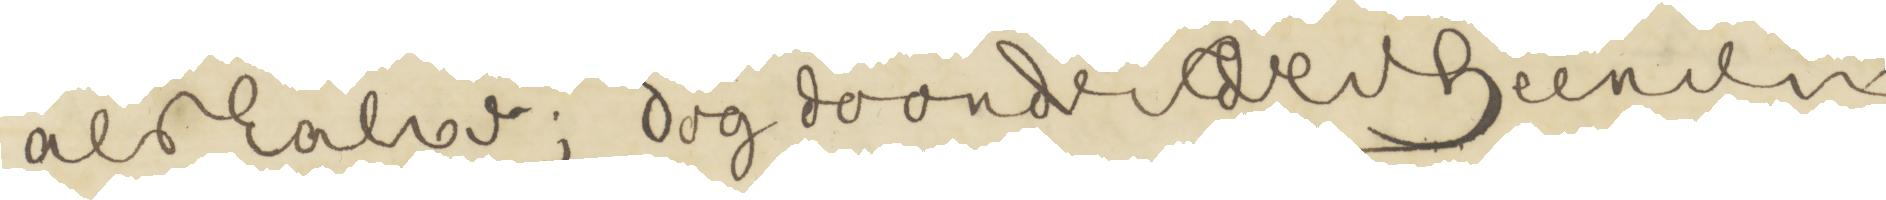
als halve; dog door de Edele Heeren
